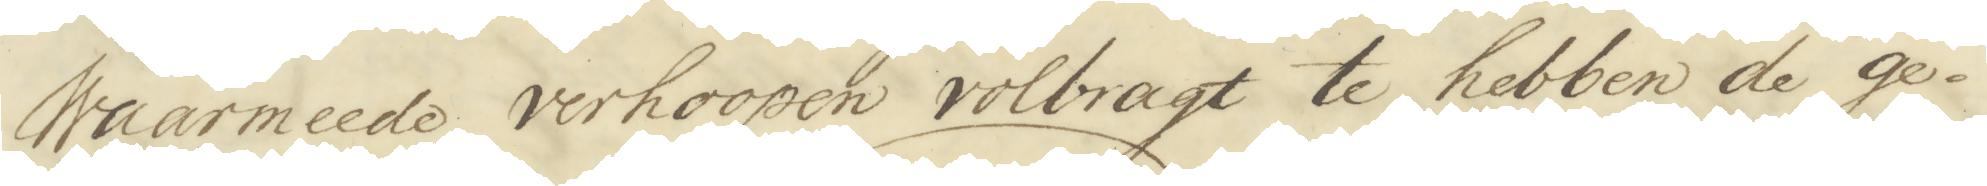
Waarmeede verhoopen volbragt te hebben de ge=
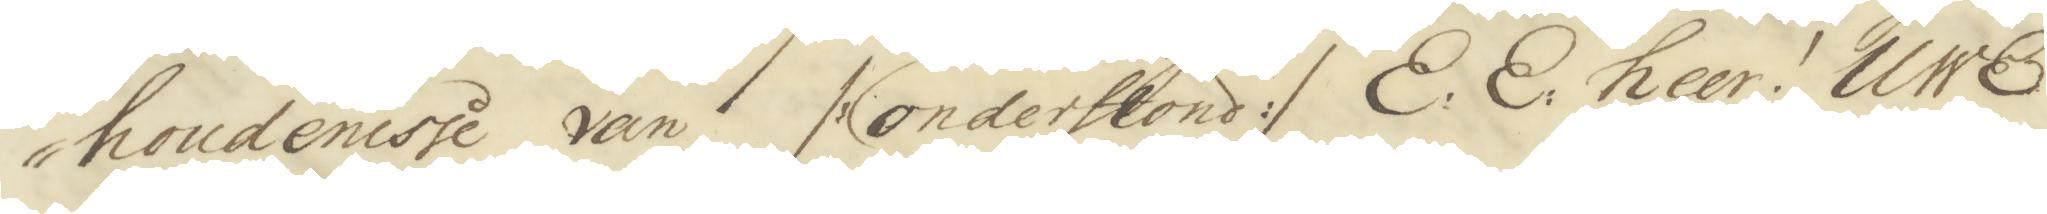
„houdenisse van /:onderstond:/ E: E: heer! UWE
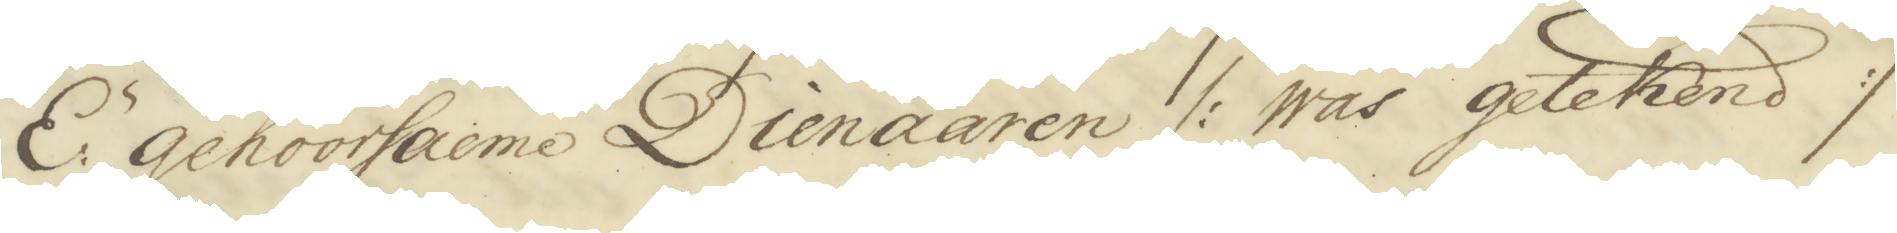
E:' gehoorsaeme Dienaaren /:was getekend:/
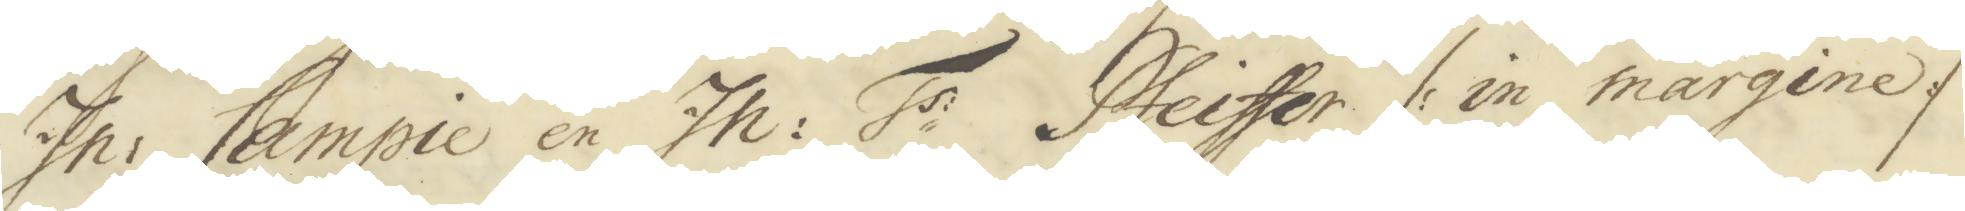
Jn: Campie en Jn: T„s: Pfeiffer /:in margine:/
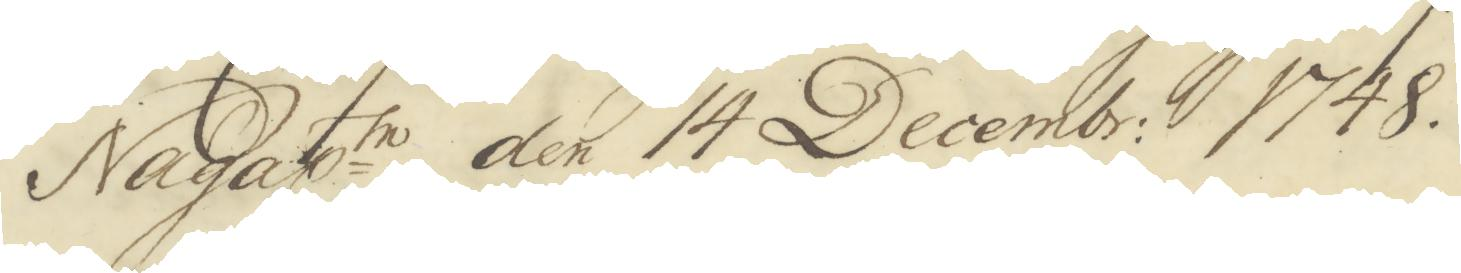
Nagap=m den 14 Decembr: 1748.
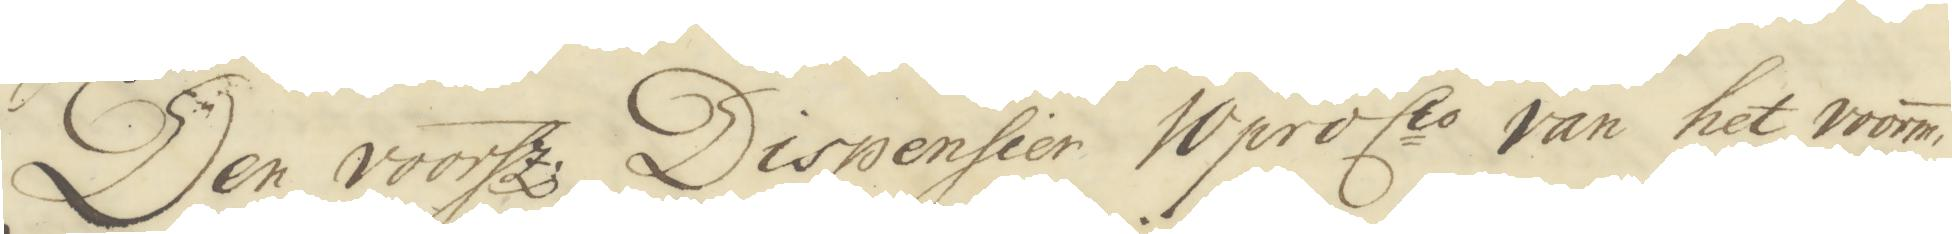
Den voorsz: Dispensier 10 proc=to van het voorm:
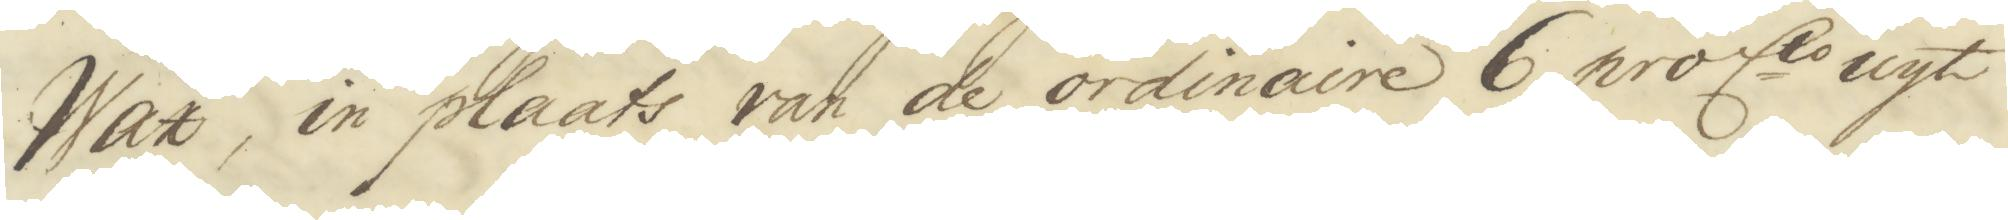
Wax, in plaats van de ordinaire 6 proc=to uyt
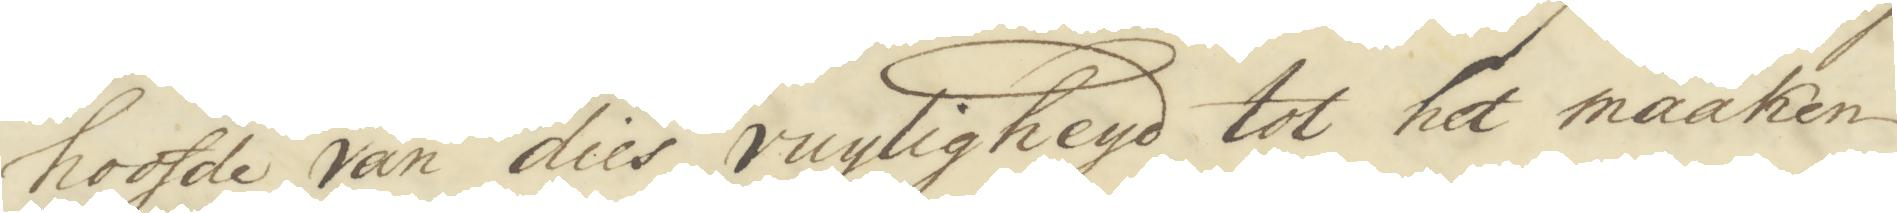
hoofde van dies vuyligheijd tot het maaken
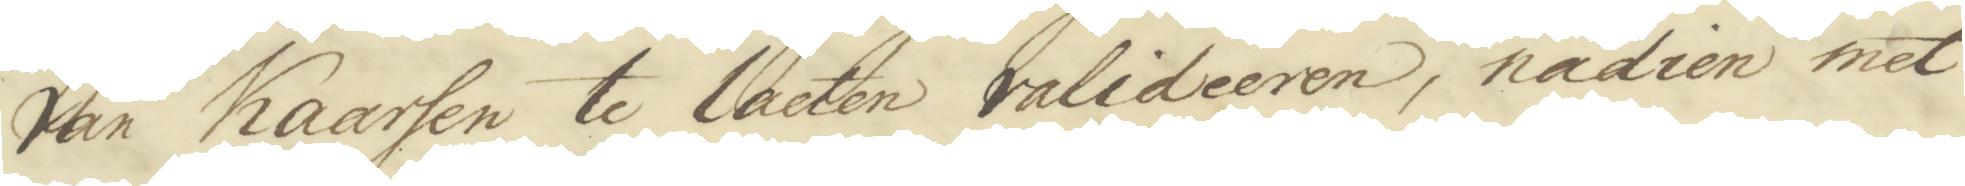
van Kaarsen te laeten valideeren, nadien met
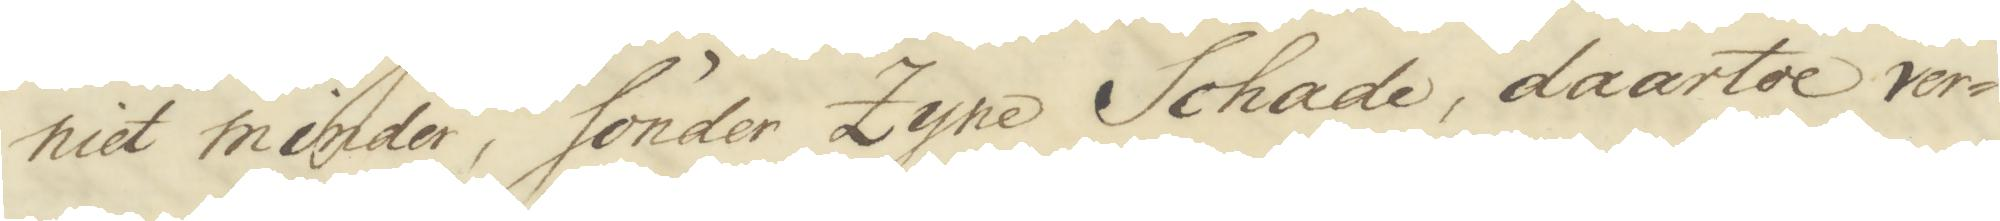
niet minder, sonder zyne schade, daartoe ver=
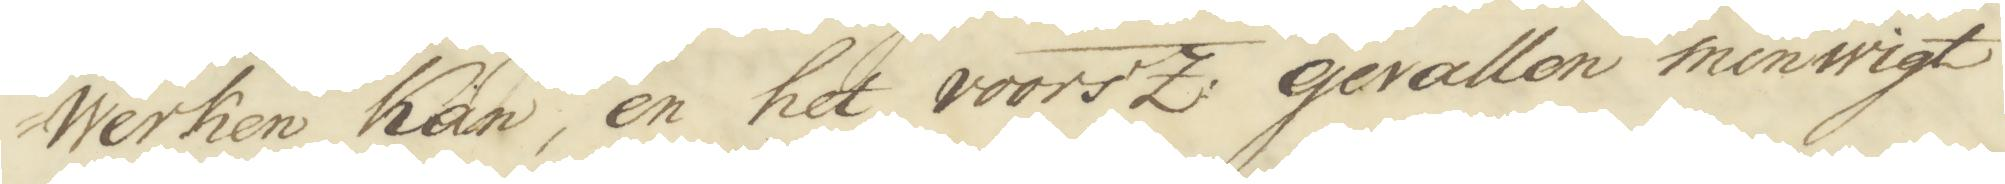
=werken kan, en het voorsz: gevallen minwigt
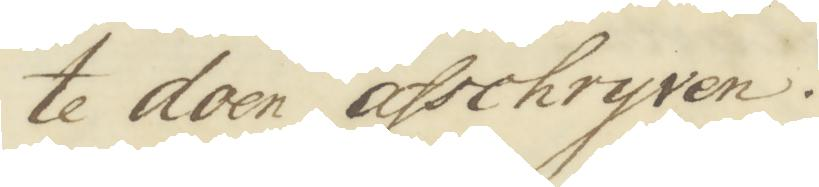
te doen afschryven.
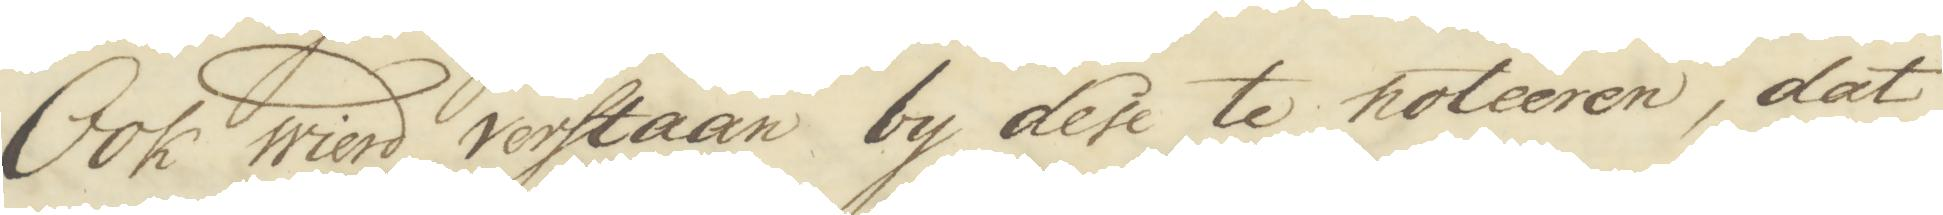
Ook wierd verstaan by dese te noteeren, dat
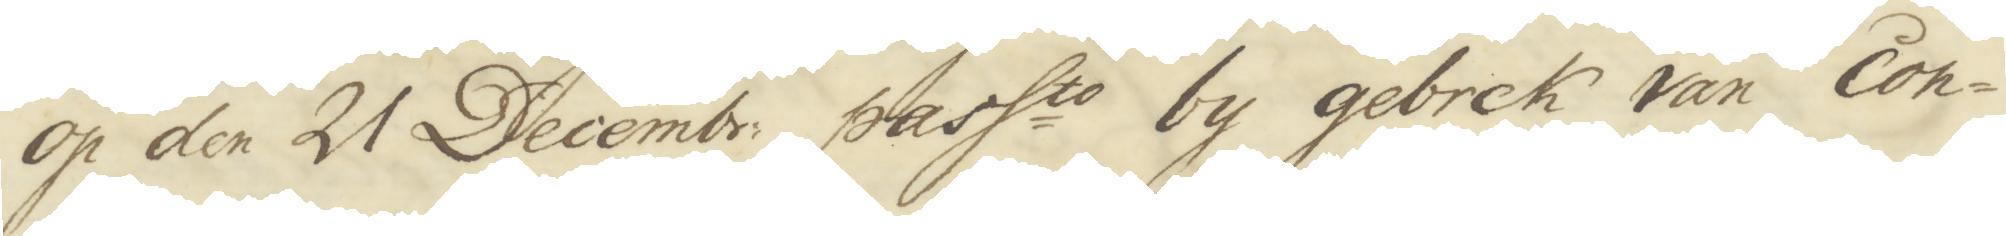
op den 21 Decembr: pass=to bij gebrek van Con=
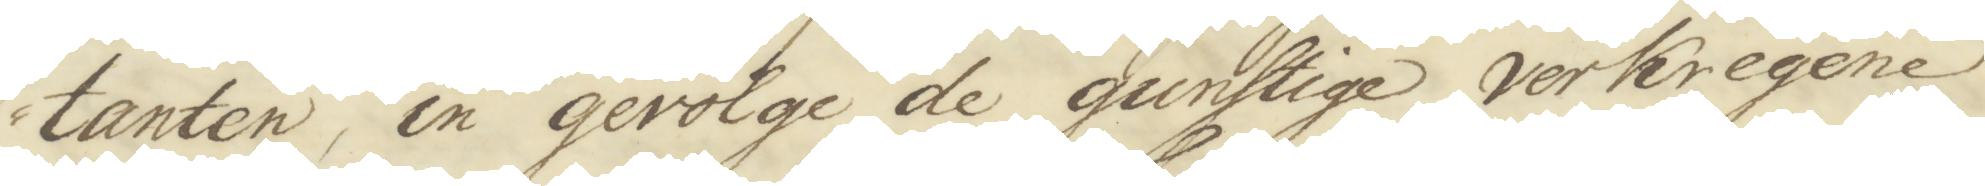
=tanten, in gevolge de gunstige verkregene
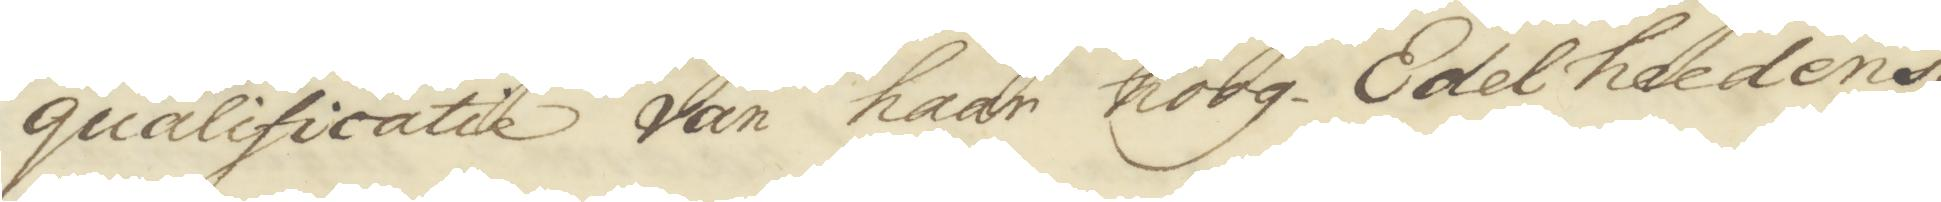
qualificatie van haar hoog- Edelheedens,
